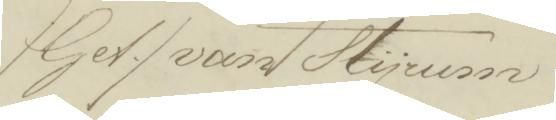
/Get:/ van Stijrum
